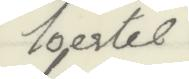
toestel
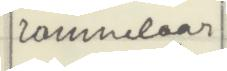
rammelaar
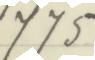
775
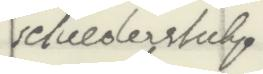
schilderstukje
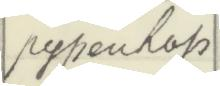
pypenkop
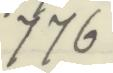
776
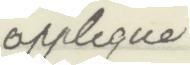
applique
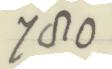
780
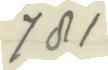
781
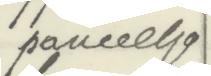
paneeltje
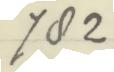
782
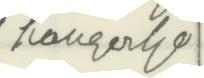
hangertje
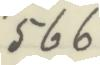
566
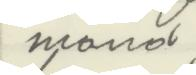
mand
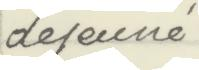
dejeuné
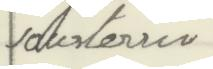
sausterrin
